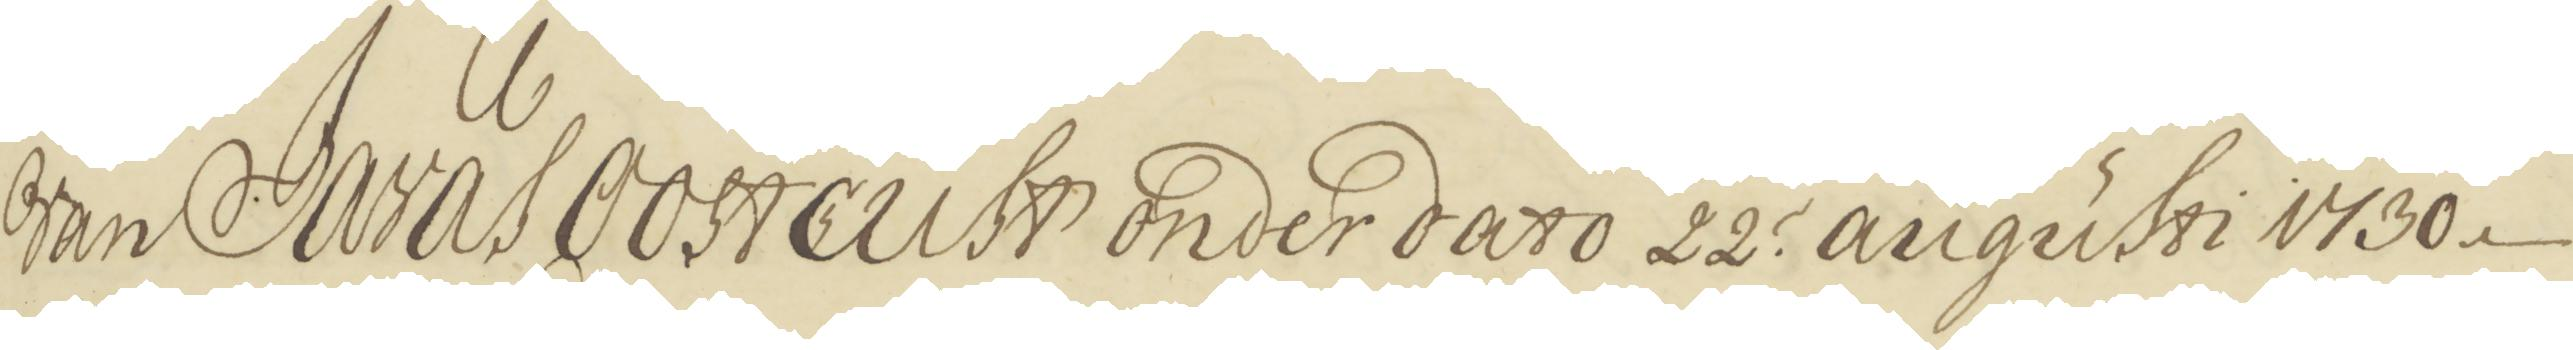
Van Javâs Oost cust onder dato 22.' augusti 1730_
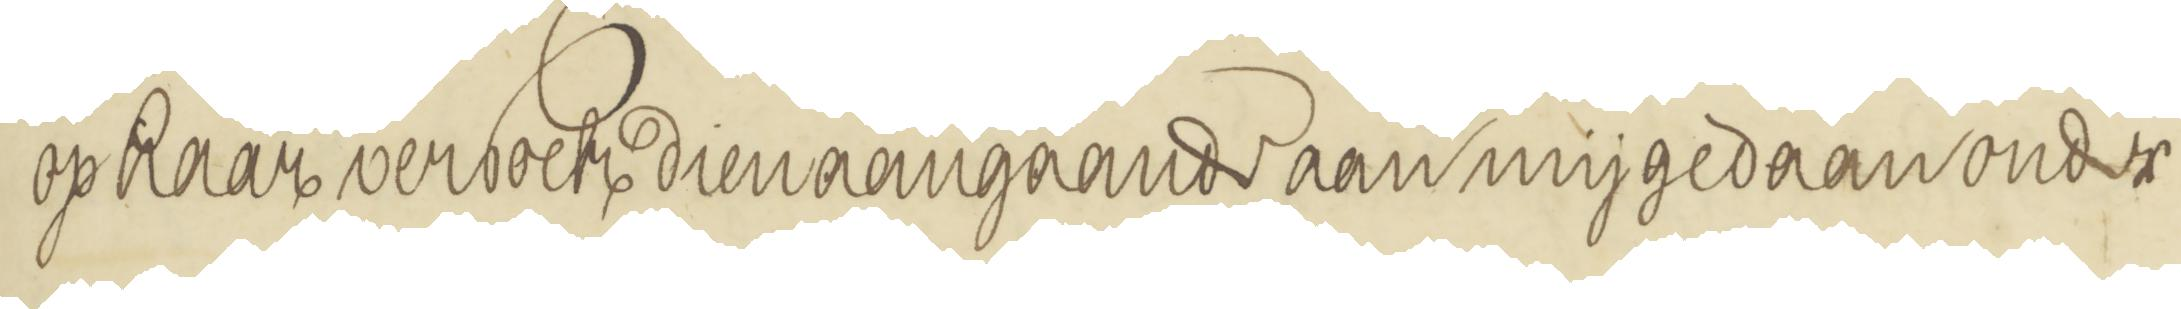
op haar versoek dien aangaande aan mij gedaan onder
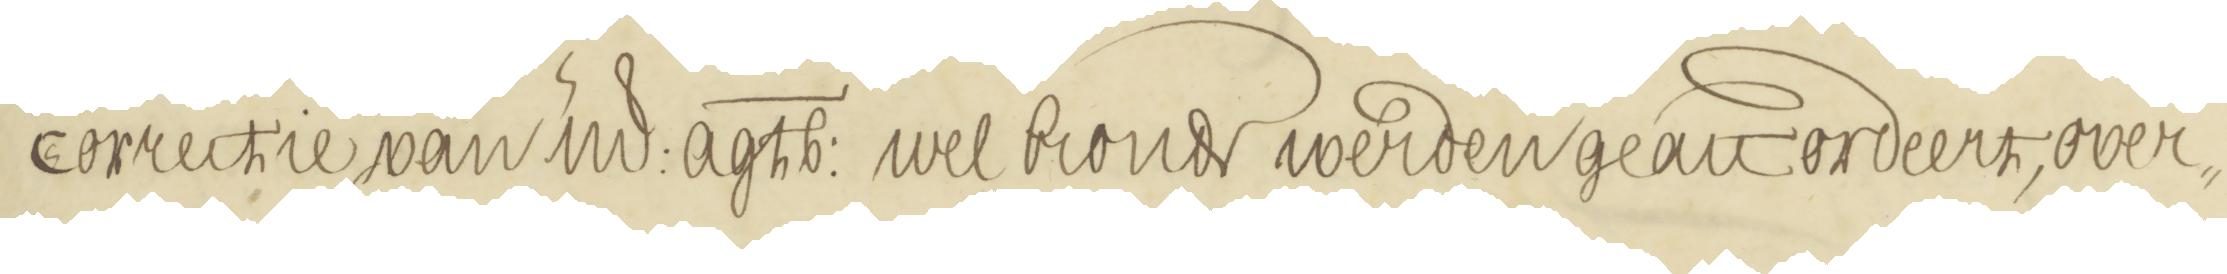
correctie van uE: agtb: wel konde werden geaccordeert, over„
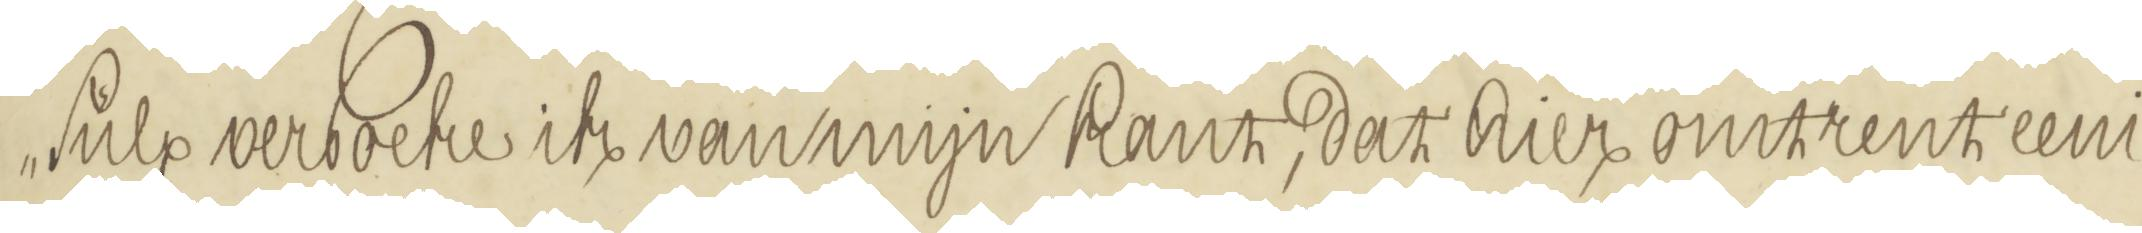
„sulx versoeke ik van mijn kant, dat hier omtrent eeni
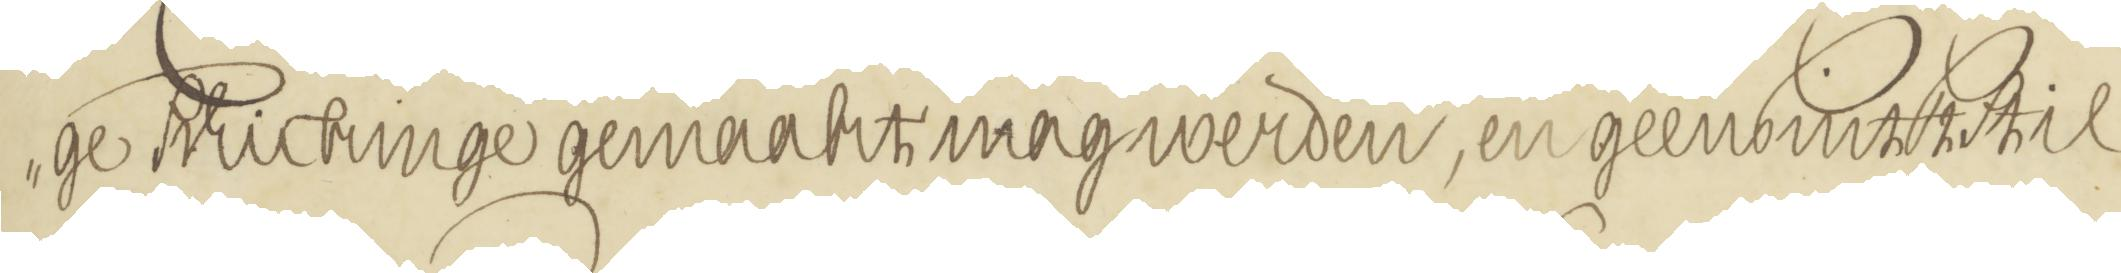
„ge schickinge gemaakt mag werden, en geensintst stil
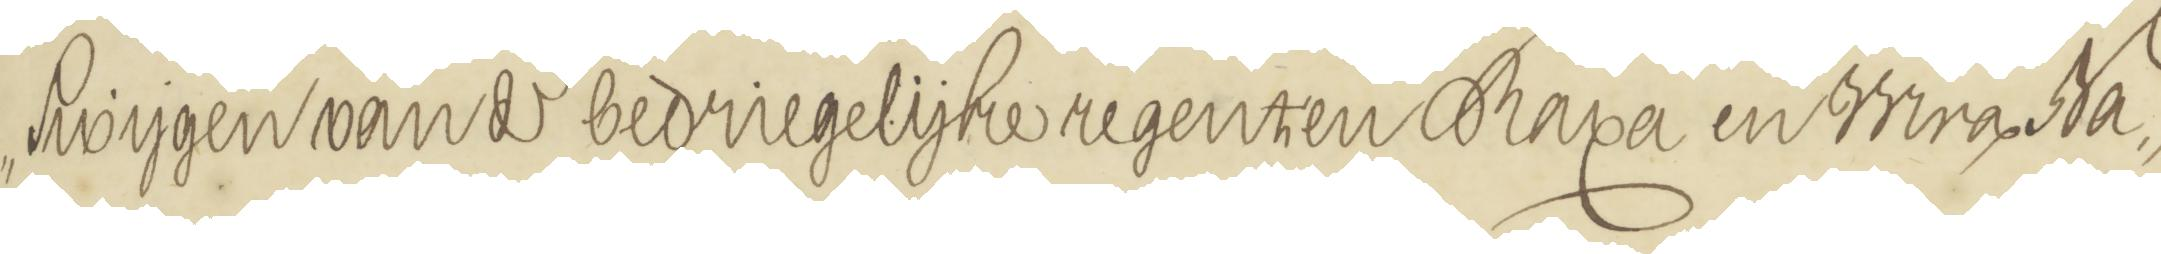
swijgen van de bedriegelijke regenten Raxa en Wira Na
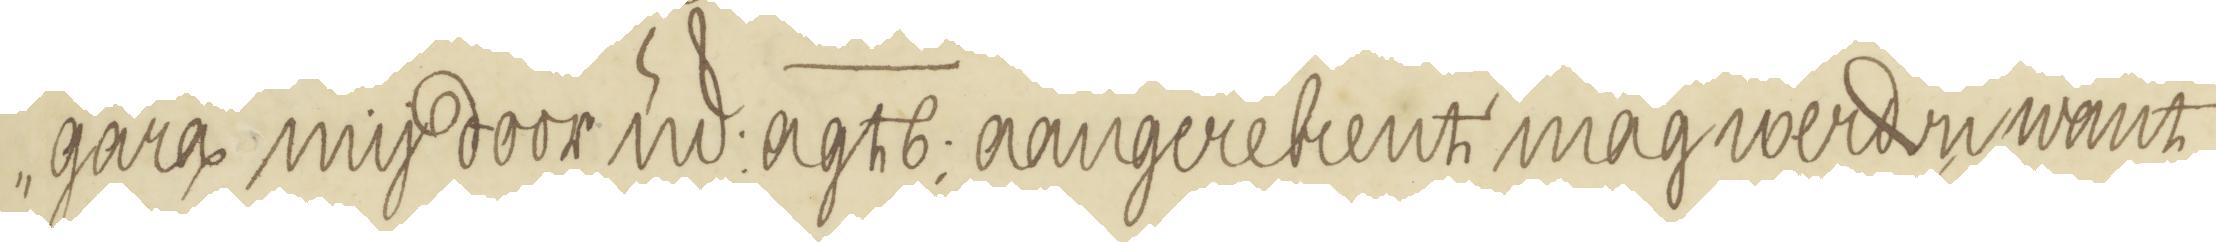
„gara mij door uE: agtb: aangerekent mag werden, want
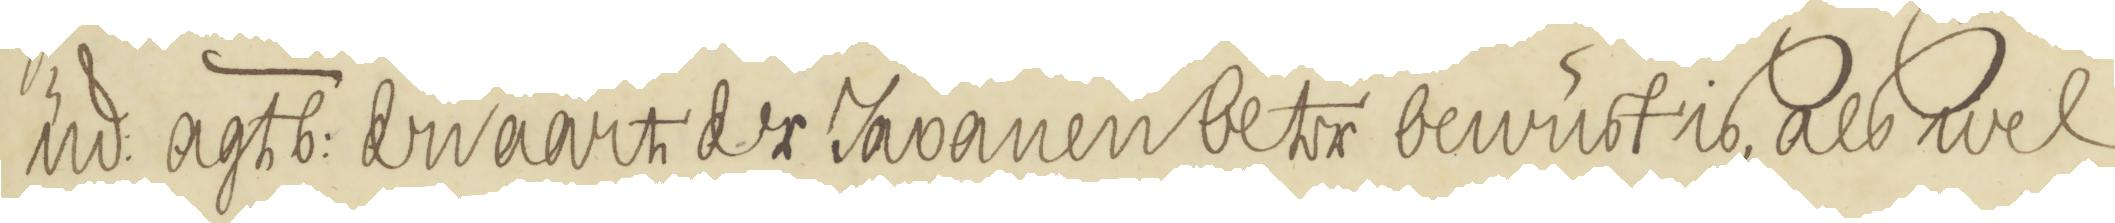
uE: agtb: dewaart der Javanen beter bewust is, als wel
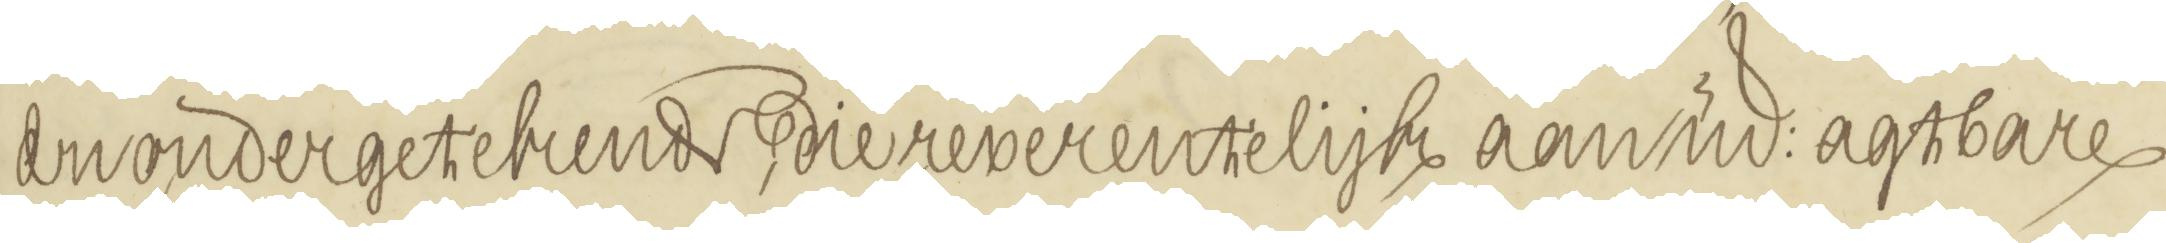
den onder getekende, die reverentelijk aan uE: agtbare
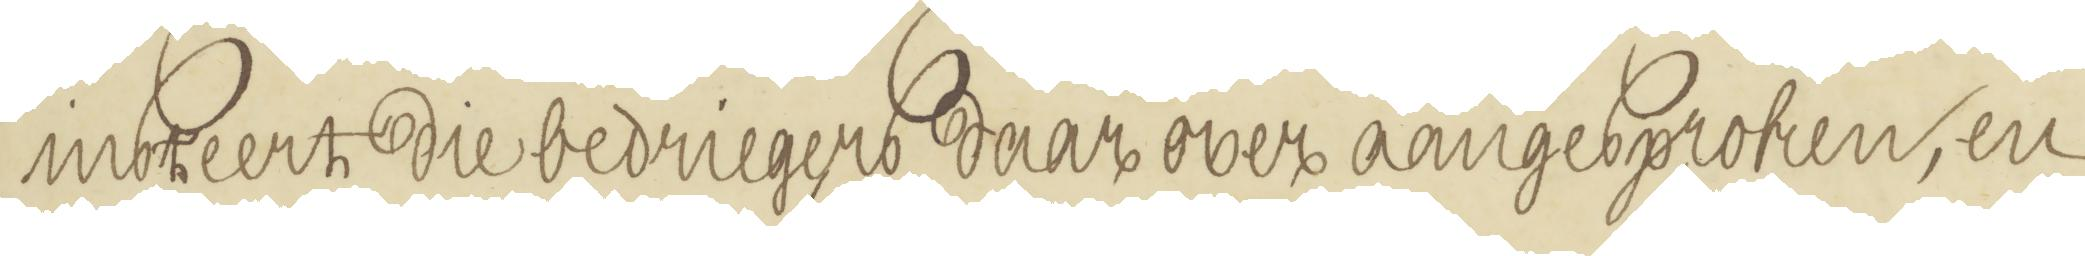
insteert die bedriegers daar over aangesproken, en
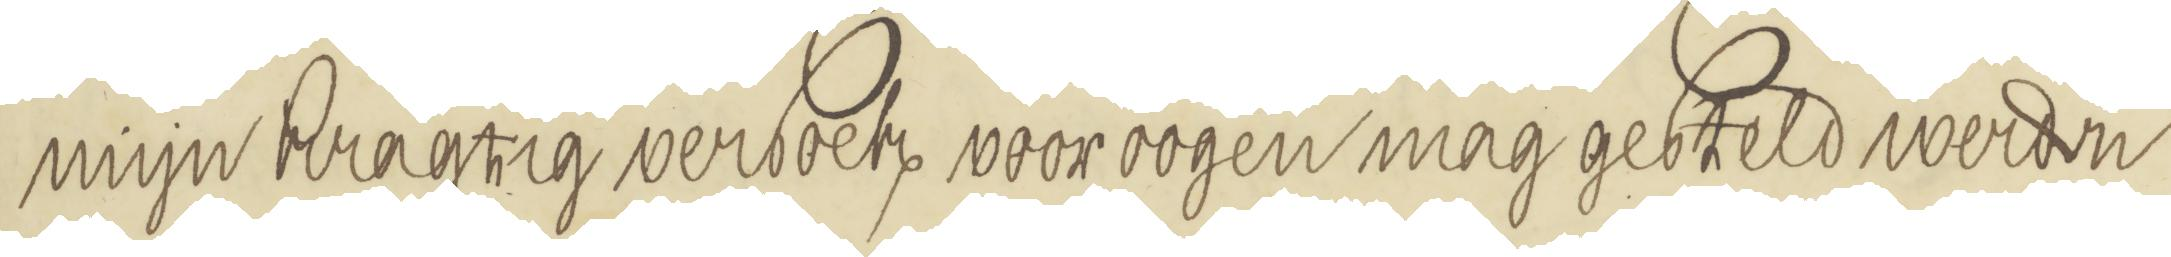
mijn kragtig versoek voor oogen mag gesteld werden
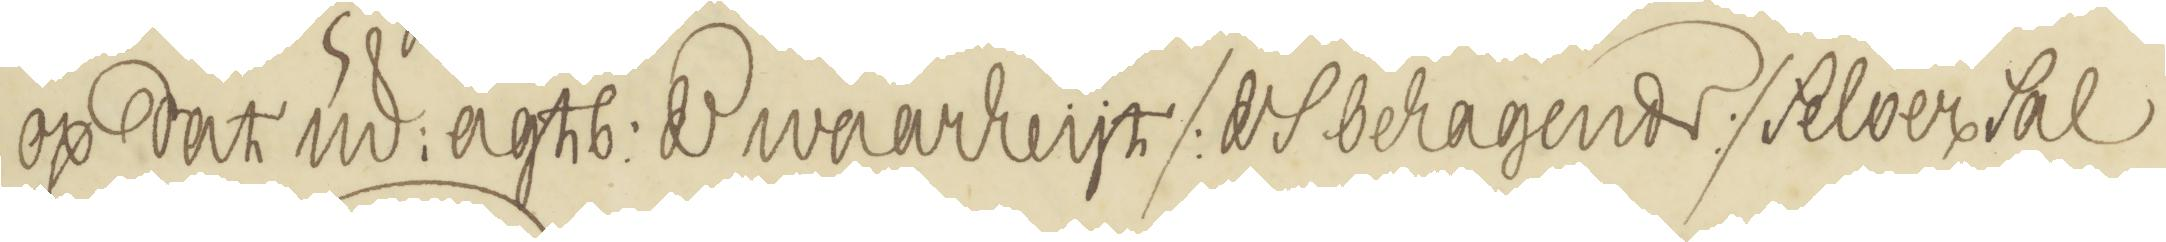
op dat uE: agtb: de waarheijt /:des behagende:/ selver sal
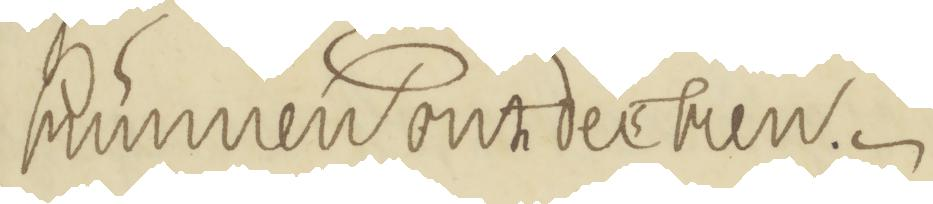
kunnen ontdecken._
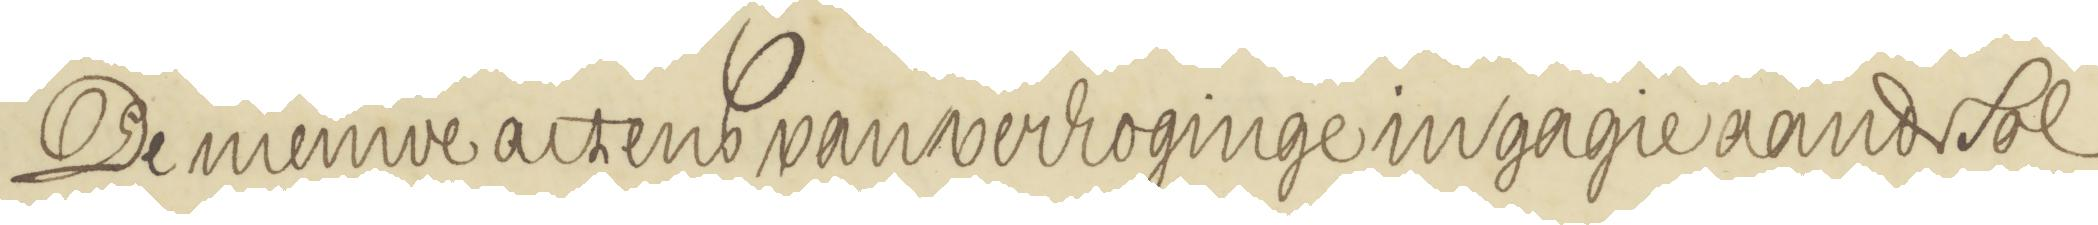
De nieuwe actens van verhoginge in gagie aan de sol
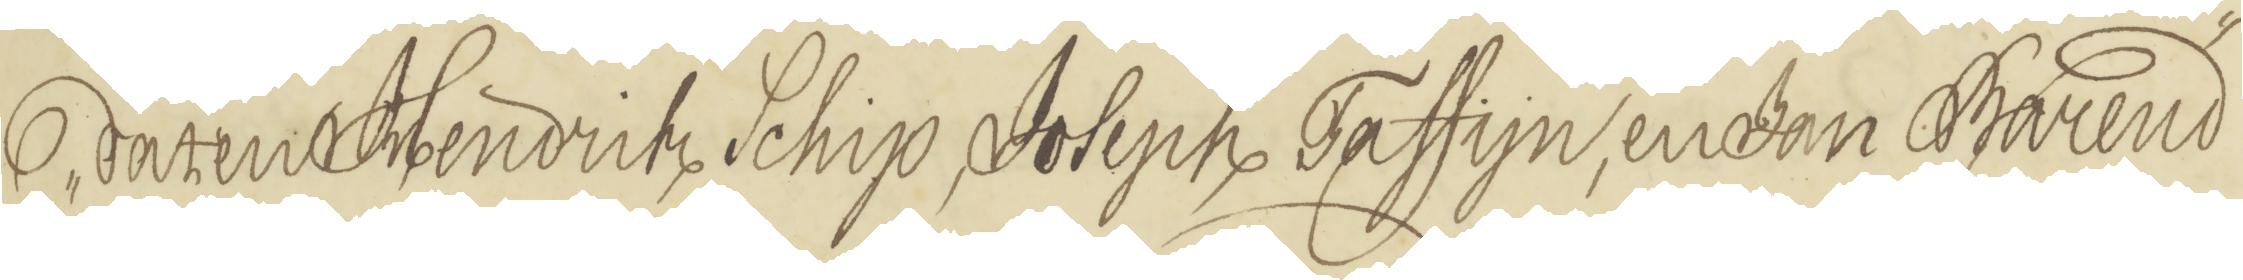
daten Hendrik schip, Joseph Taffijn, en Jan Barend
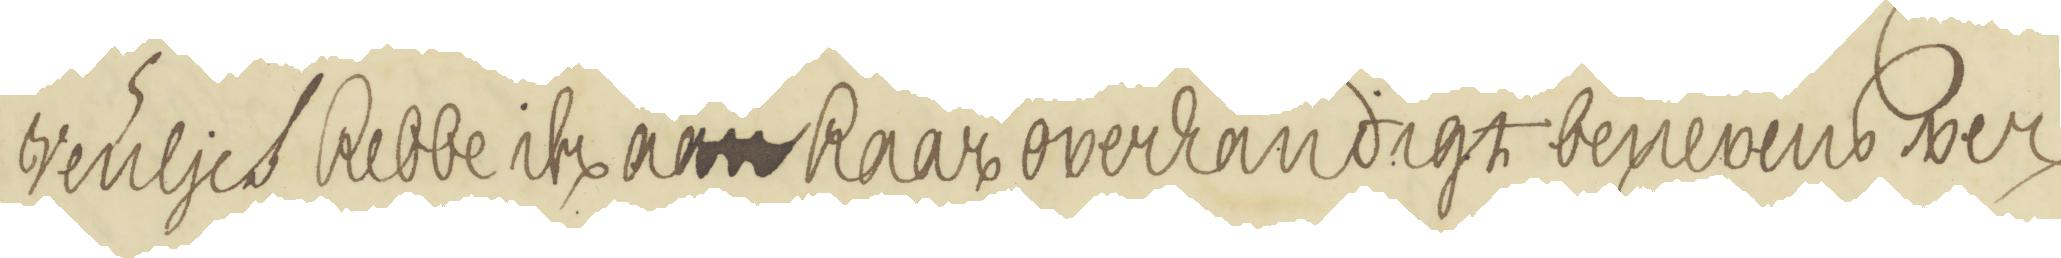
veuljes hebbe ik aan haar overhandigt benevens ver
